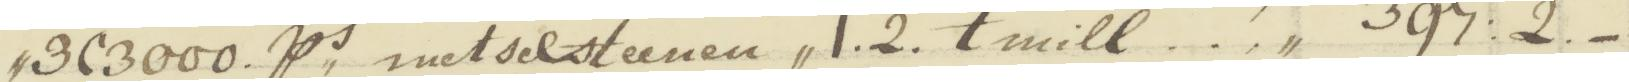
„353000. p„s metselsteenen „ 1.2. 't mill . . . „ 397:2.–
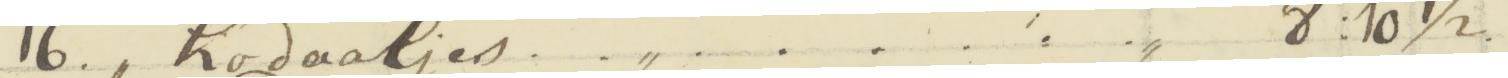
16. „ hodaaljes . . „ . . . . . . „ 8:10½
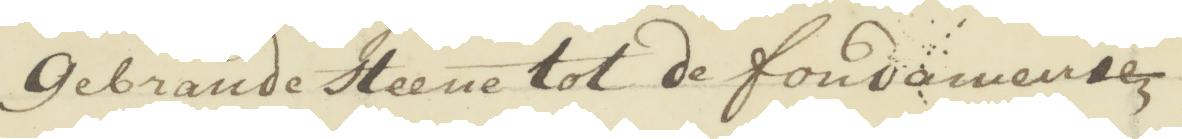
gebrande steene tot de fondamenten
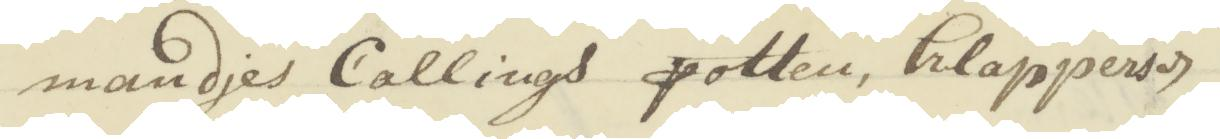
mandjes Callings potten, klappers en
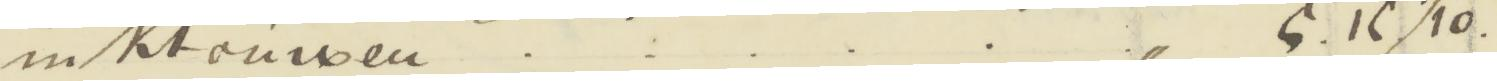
inktouwen . . . . . . „ 5.15.1/10.
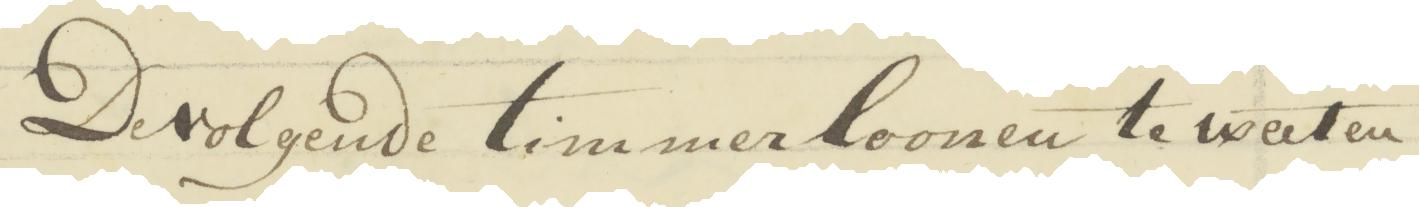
De volgende timmerloonen te weeten
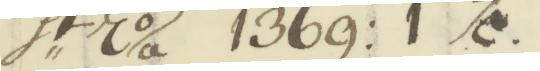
s„t ro/a 1369:1 3/5.
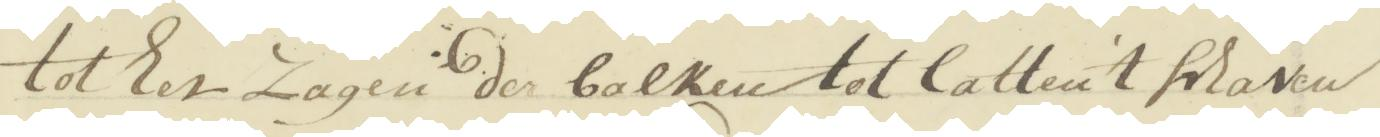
tot het zagen der balken tot latten 't schaven
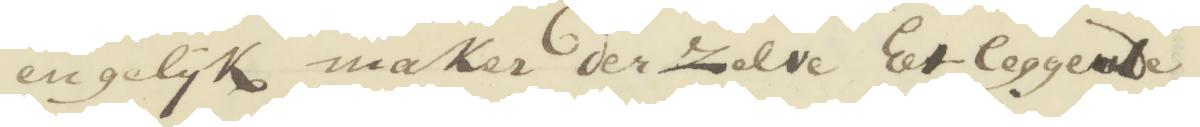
en gelijk maker der zelve het leggende
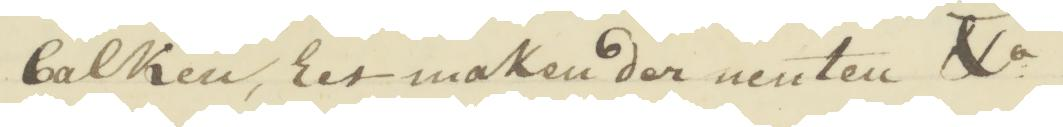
balken, het maken der nenten &:a
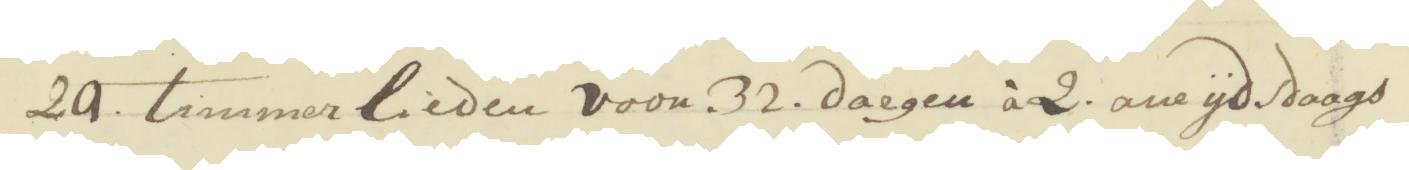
24. timmer lieden voor 32. daegen à 2. ane ijdsdaags
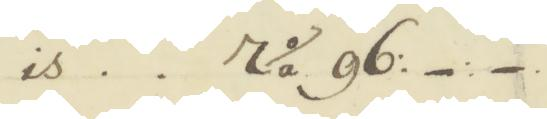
is . . ro/a 96:–:–
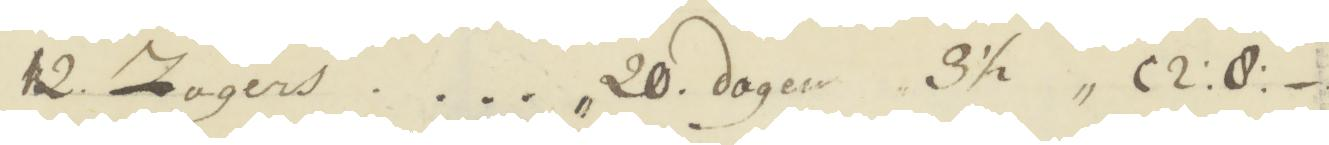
12. Zagers . . . . „ 20. dagen „ 3½ „ 52:8:—
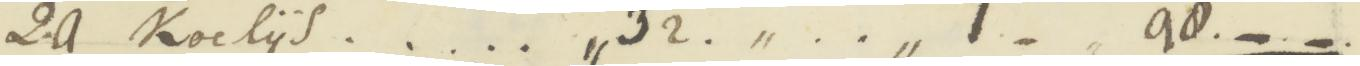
24 koelijs . . . . . „ 32. „ . . „ 1 - „ 98.–.–.
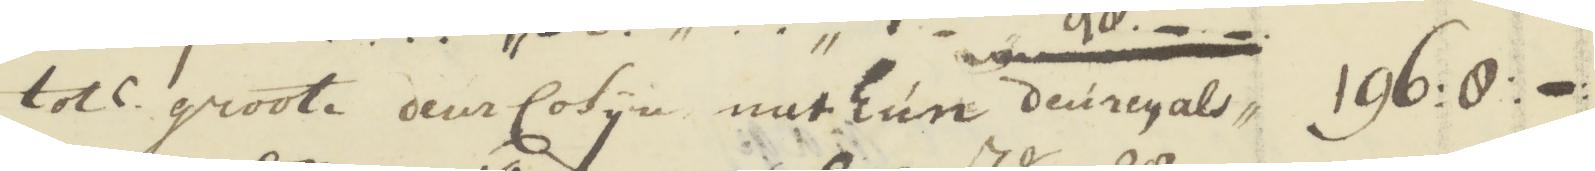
tot 5. groote deur Cosijn met hun deuren als„ 196:8:–
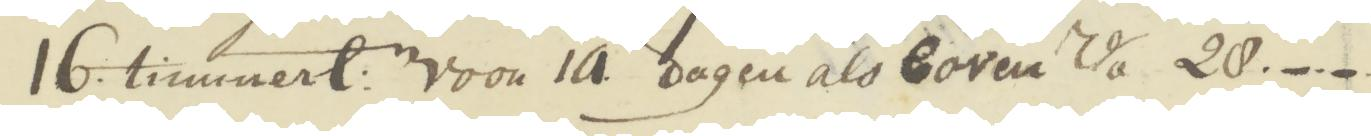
16. timmerl: voor 14. dagen als boven ro/a 28.–.–
